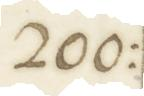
200:
